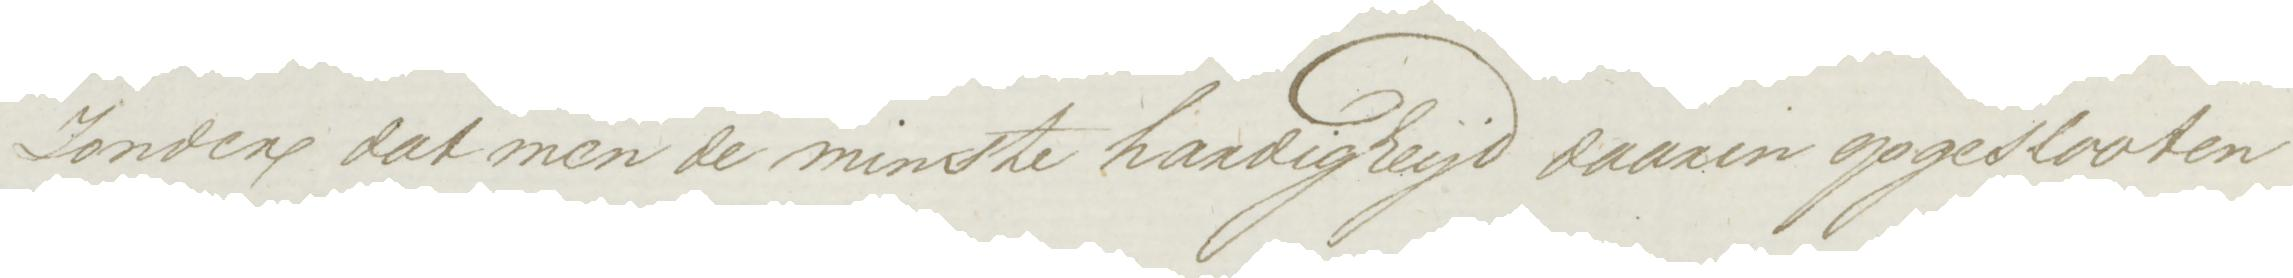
zonder dat men de minste hardigheijd daarin opgeslooten
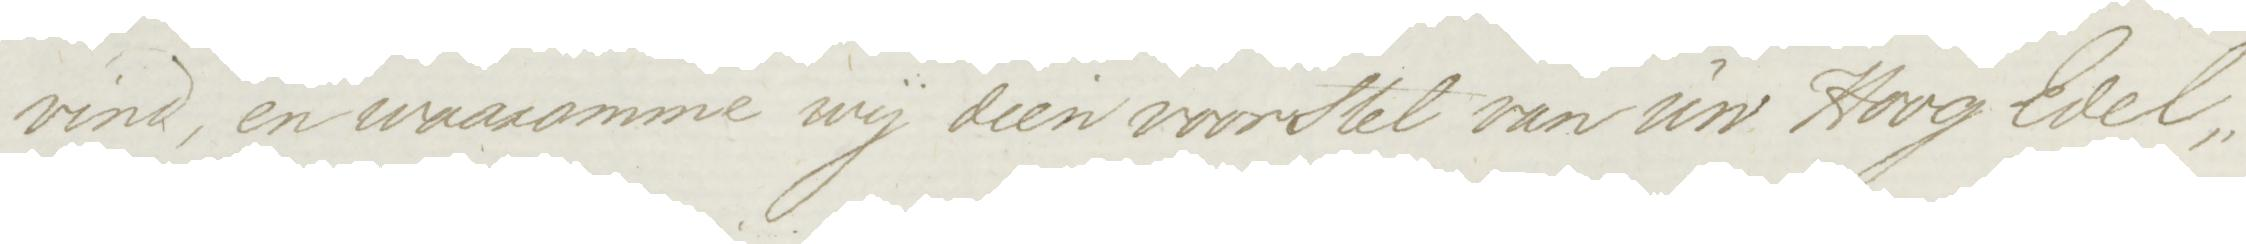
vind, en waaromme wij dien voorstel van uw Hoog Edel„
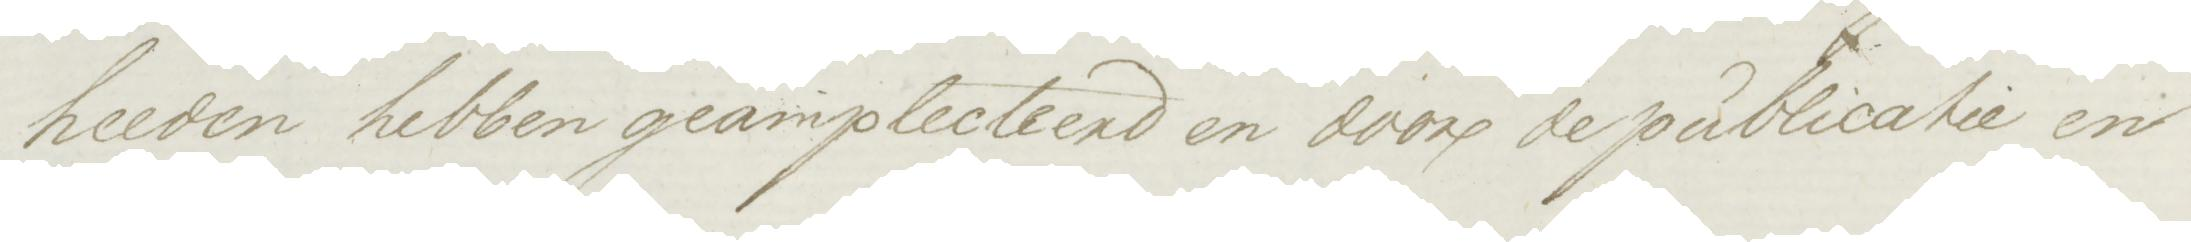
heeden hebben geamplecteerd en door de publicatie en
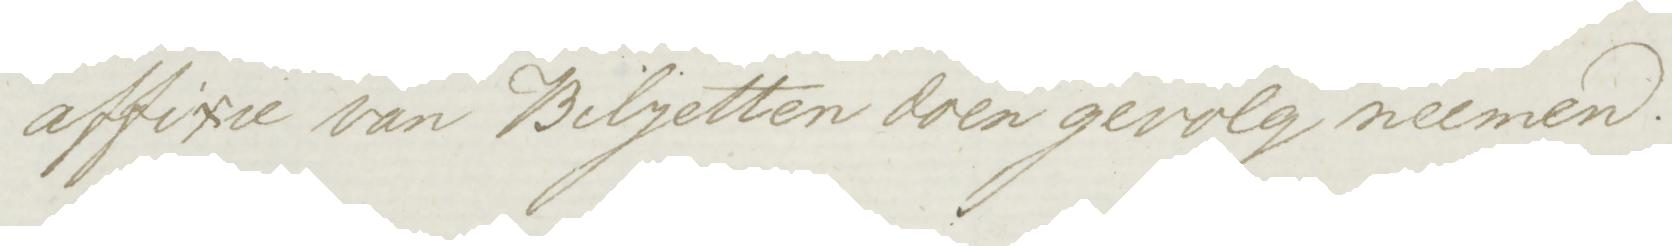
affixie van Biljetten doen gevolg neemen
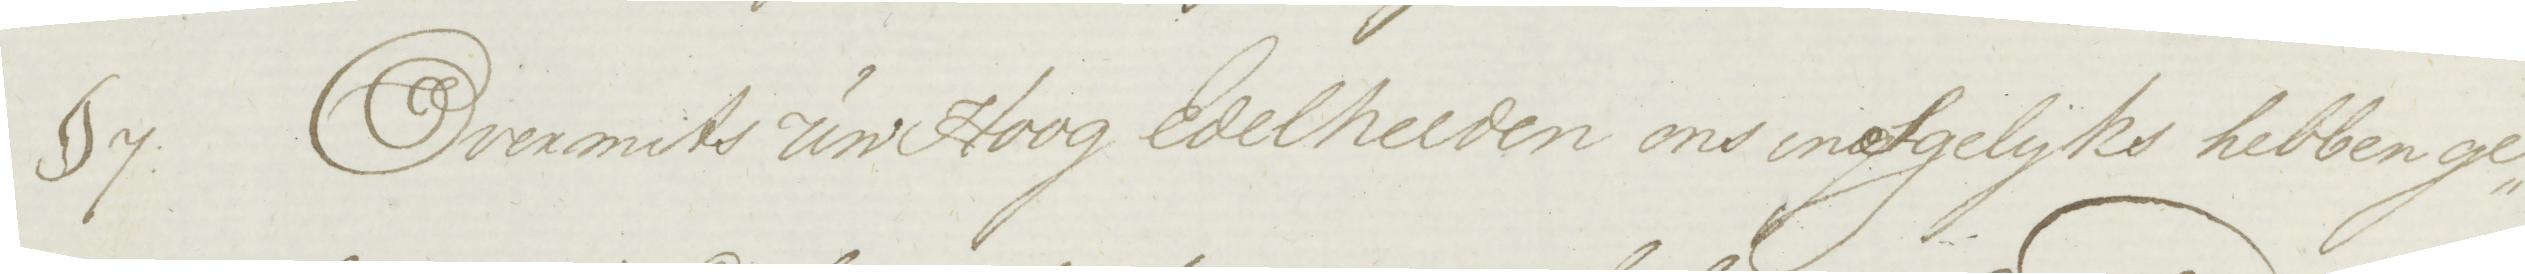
§7: Overmits uw Hoog Edelheeden ons insgelijks hebben ge„
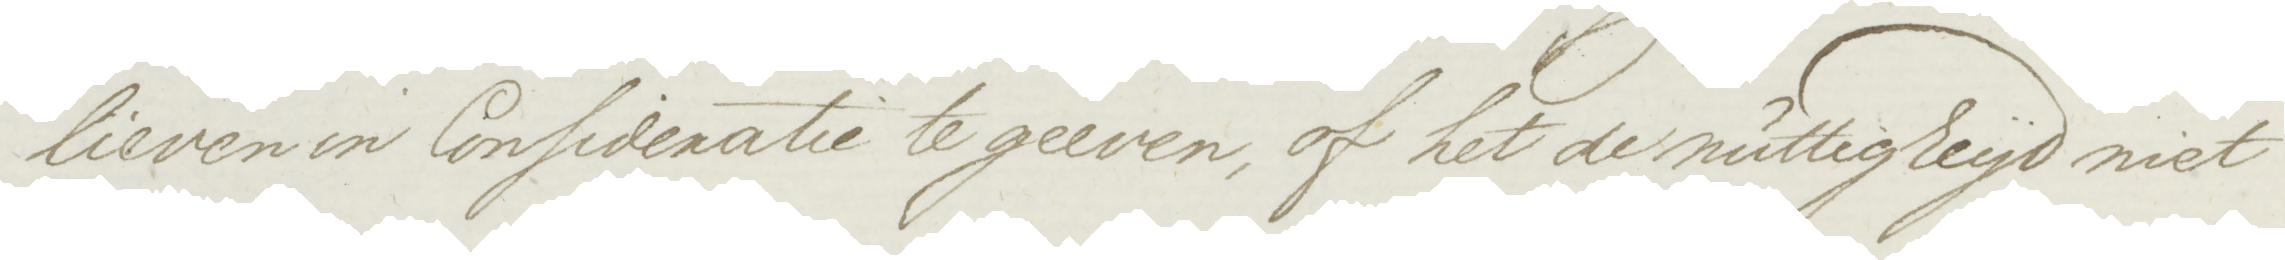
lieven in Consideratie te geeven, of het de nuttigheijd niet
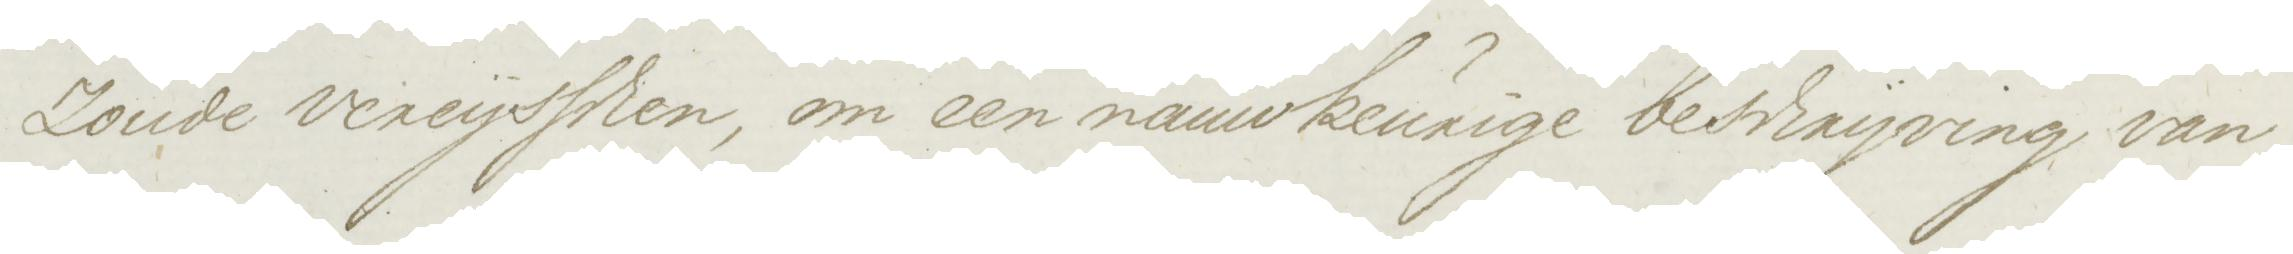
zoude vereijsschen, om een nauwkeurige beschrijving van
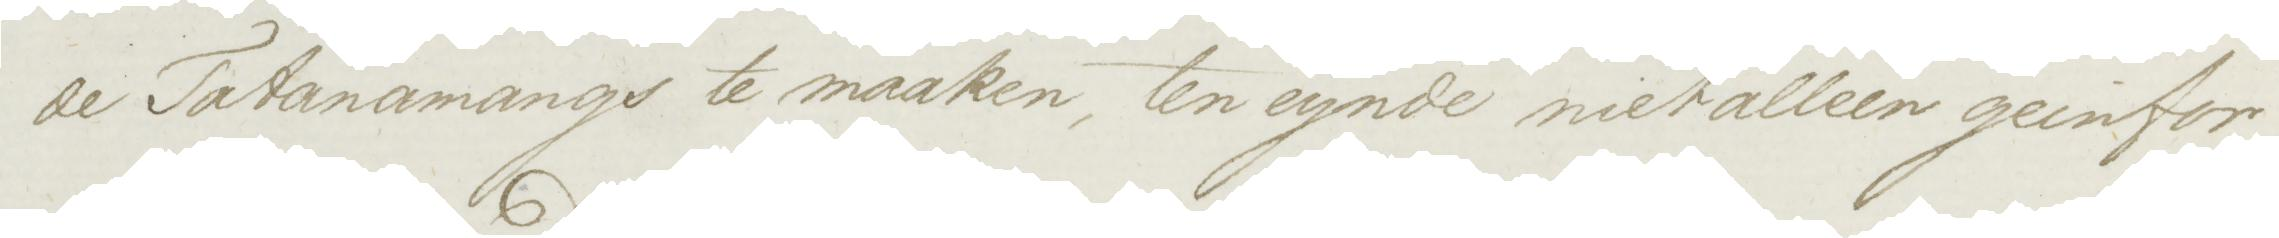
de Tatanamangs te maaken, ten eijnde niet alleen geinfor
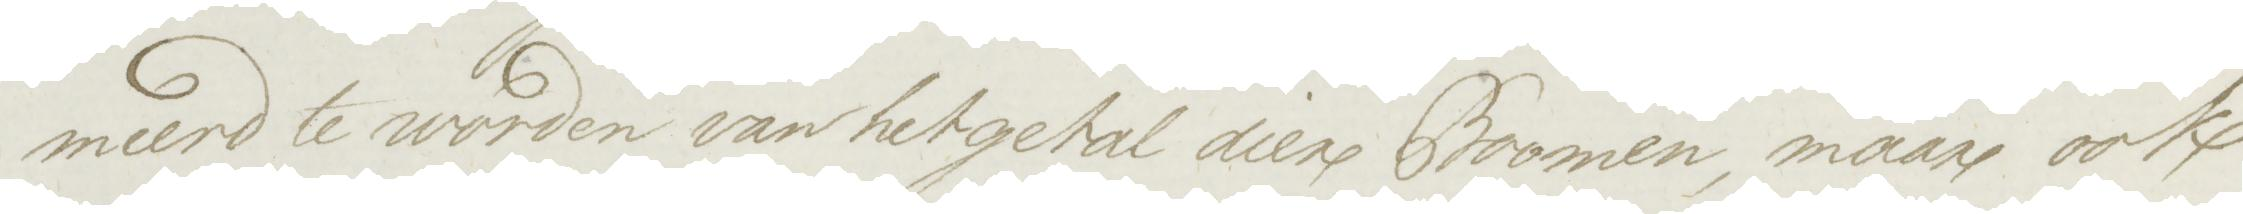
meerd te worden van het getal dier Boomen, maar ook
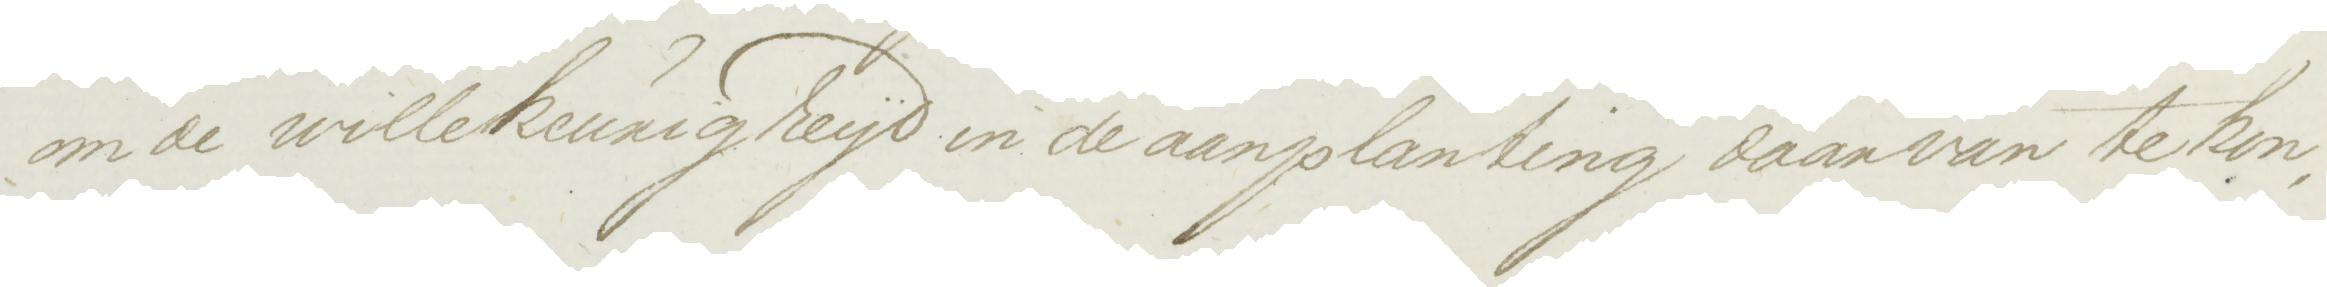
om de willekeurigheijd en de aanplanting daar van te kon„
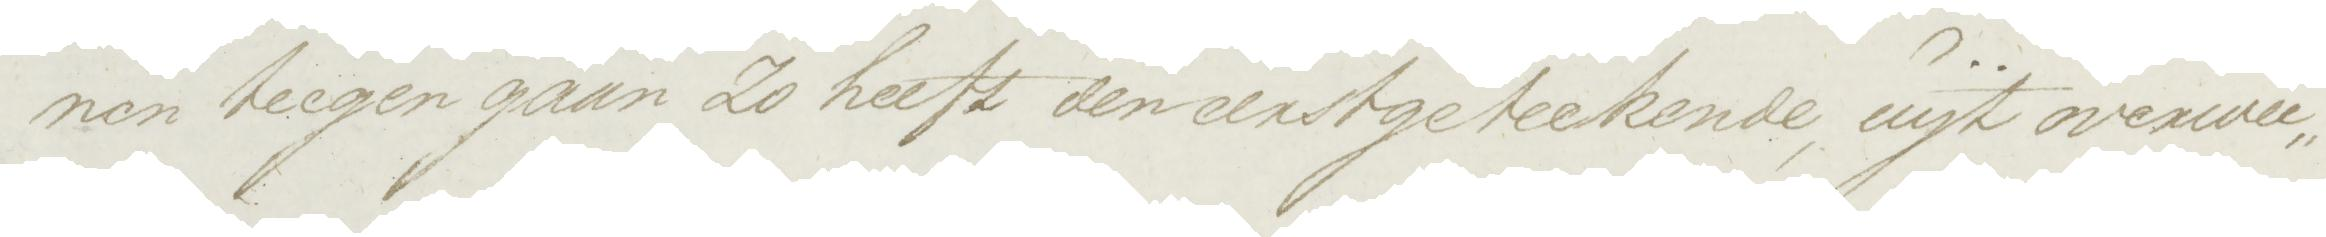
nen teegen gaan zo heeft den eerstgeteekende, uijt overwee„
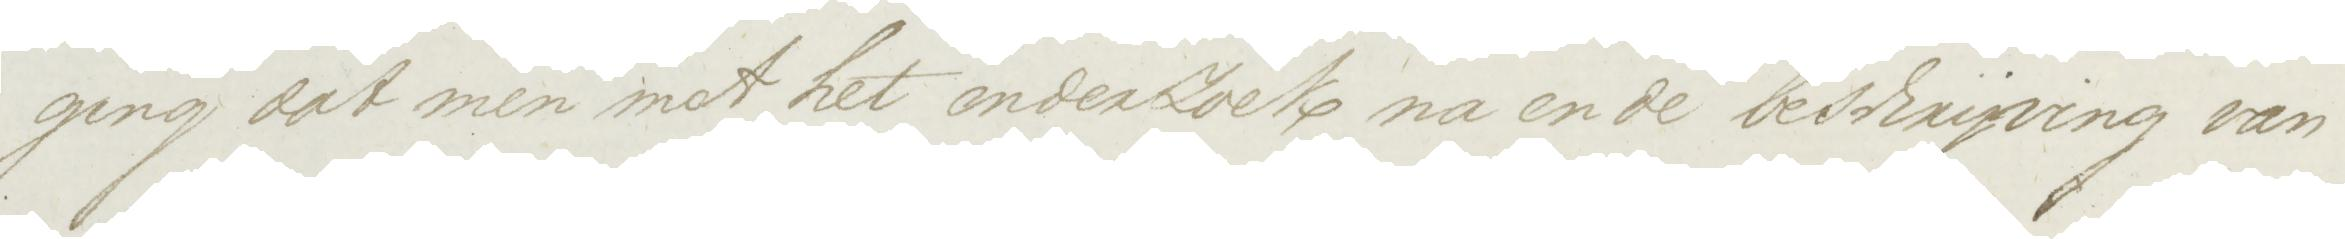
ging dat men met het onderzoek na ende beschrijving van
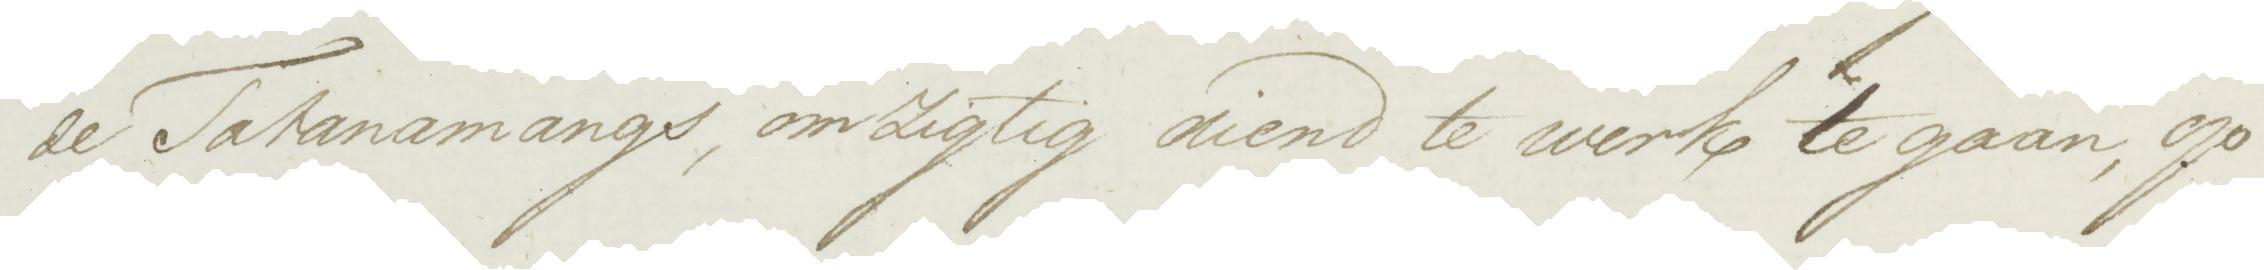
de Tatanamangs, omzigtig diend te werk te gaan, op
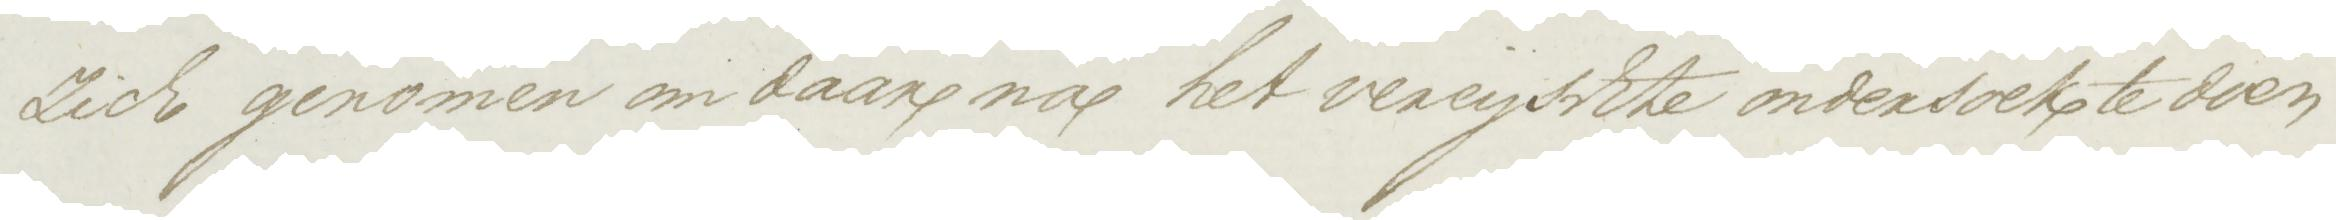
zich genomen om daar na het vereijschte ondersoek te doen
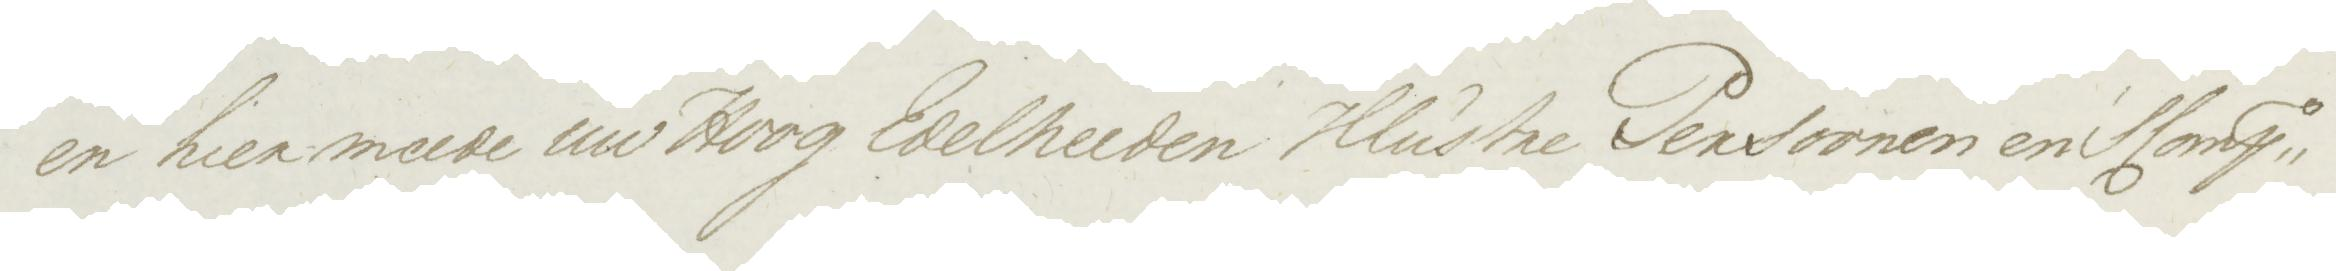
en hier meede uw Hoog Edelheeden Illustre Persoonen en ’sComp„s
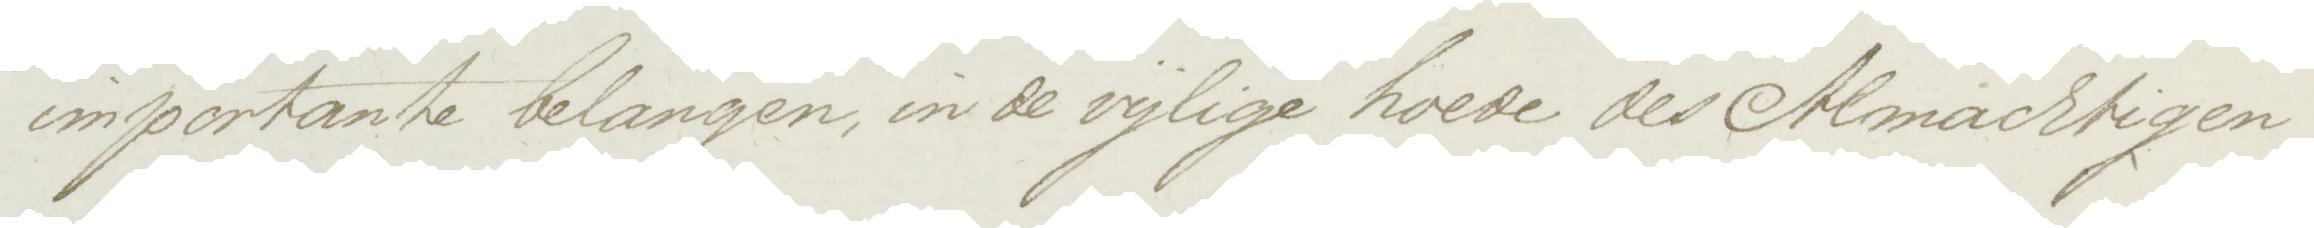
importante belangen, in de vijlige hoede des Almachtigen
